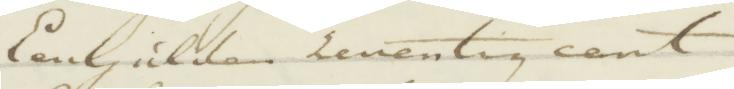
Een Gulden zeventig cent
